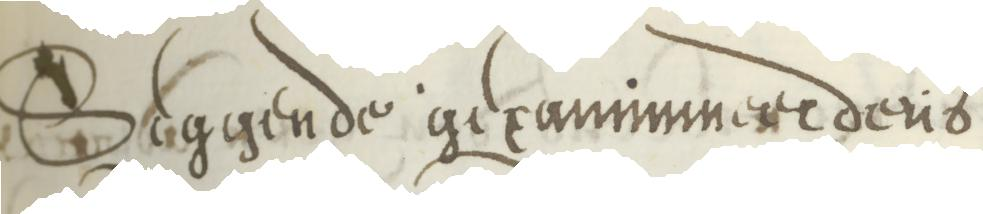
Seggende gexaminneerdens
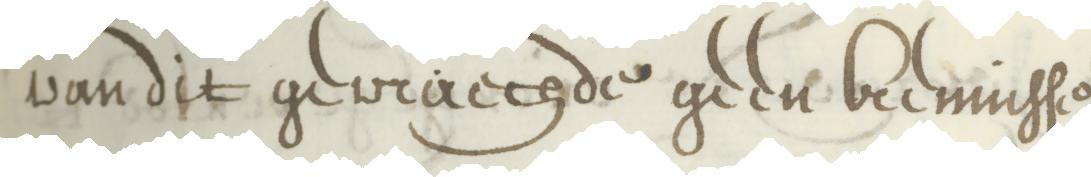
van dit gevraechde geen kennisse
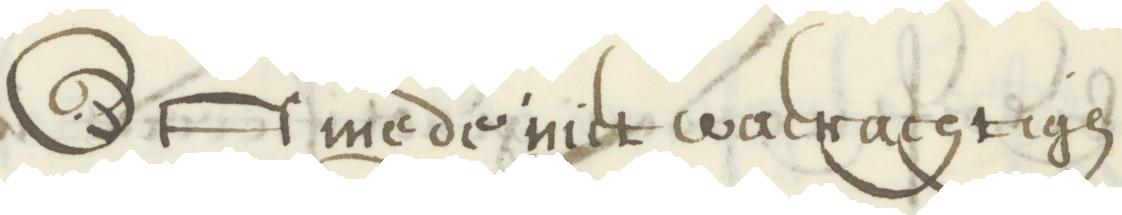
Off mede niet waerachtigen
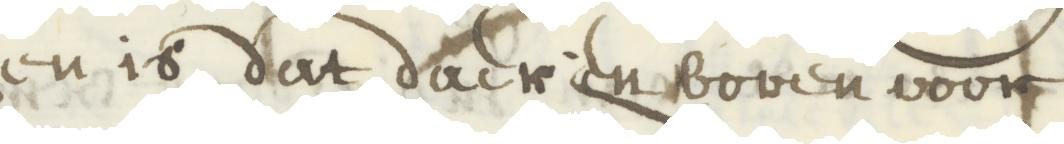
en is dat daer en boven voor
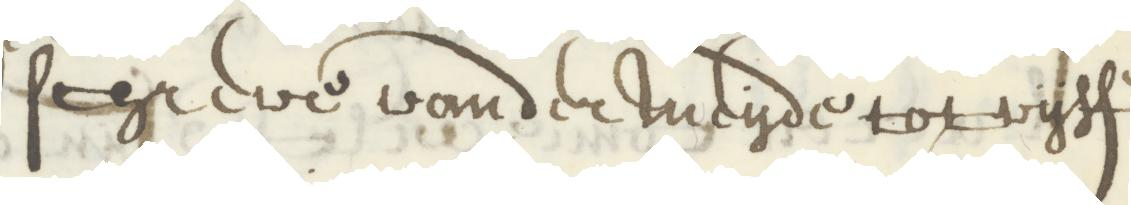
schreve van der meijde tot vijff
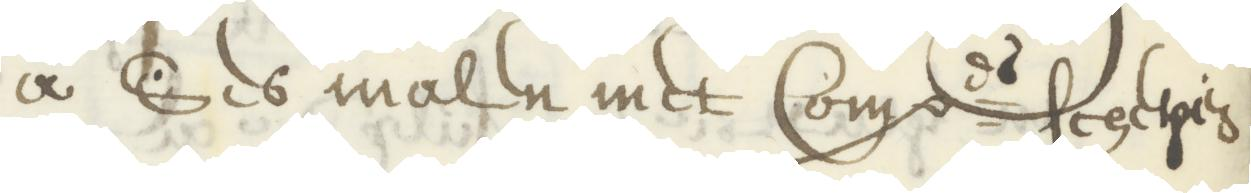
a ses malen met Comp=es schepen
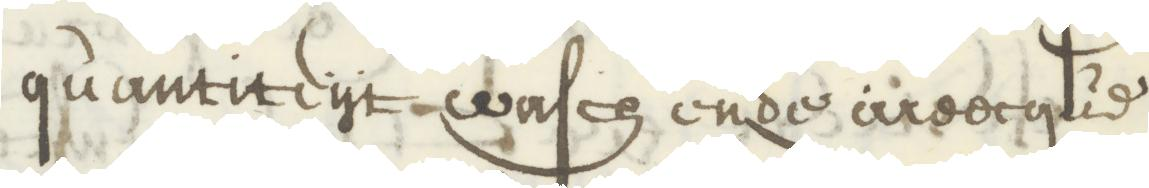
quantiteijt wasch ende weecque
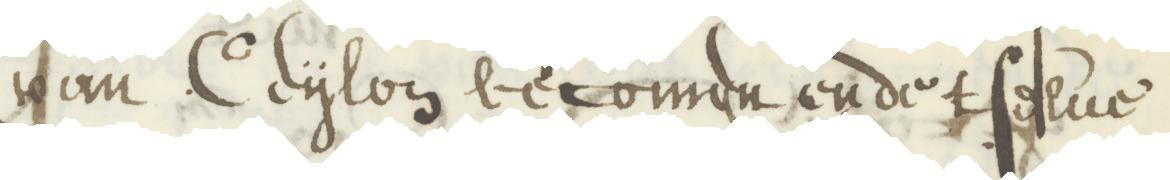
van Ceijlon becomen ende tselve
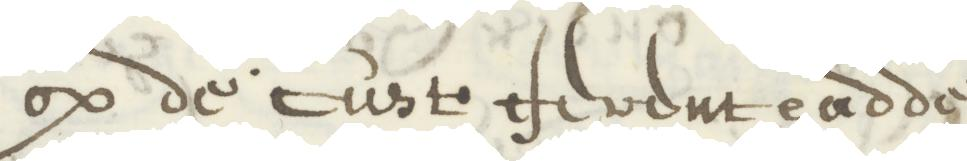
op de cust gevent hadde
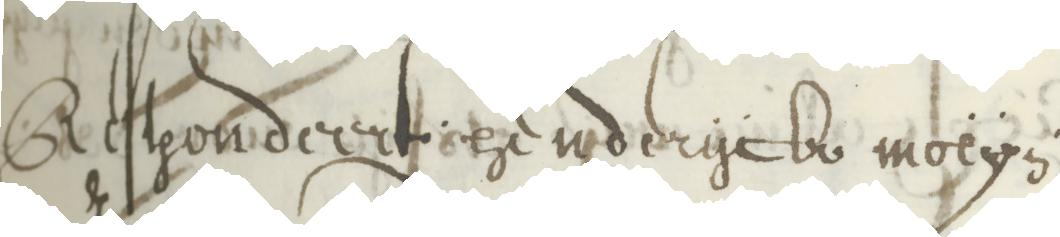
Respondeert henderijck molijen
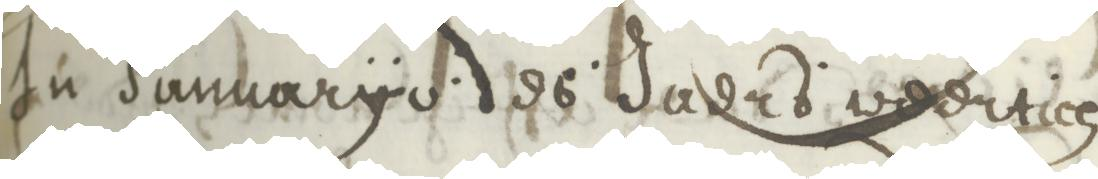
In Ianuarijo des Jaers veertich
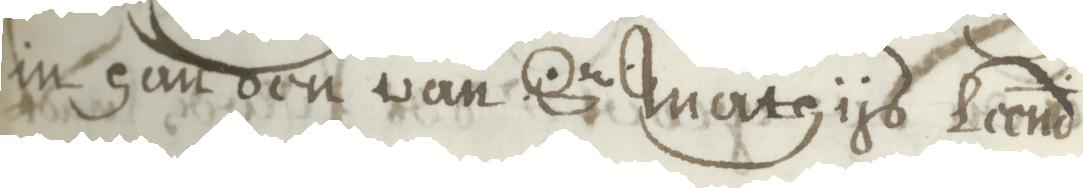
in hem den van sr mathijs land
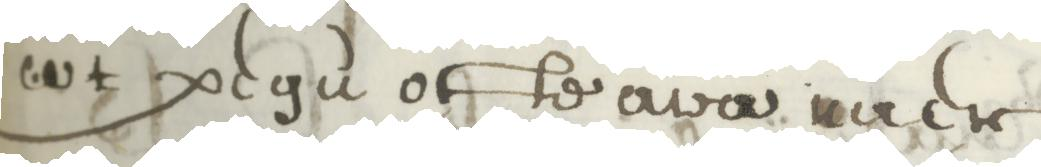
wt pegu ofte avae naer
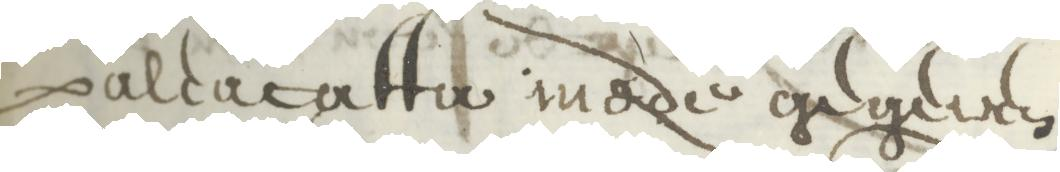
paleacatta mede gegeven
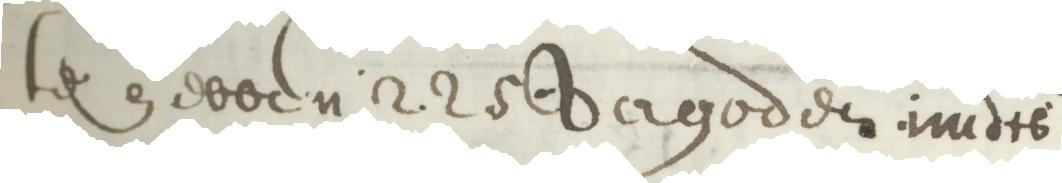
te hebben 2.25 Pagoden midts
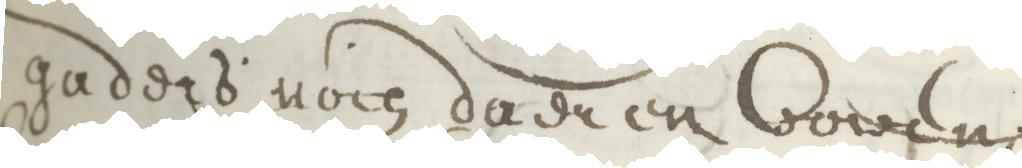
gaders noch daer en boven
